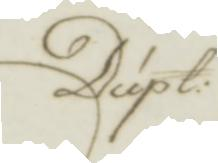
Dupl
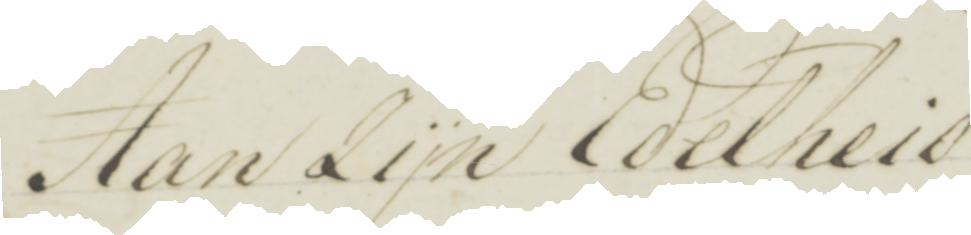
Aan zijn Edelheid
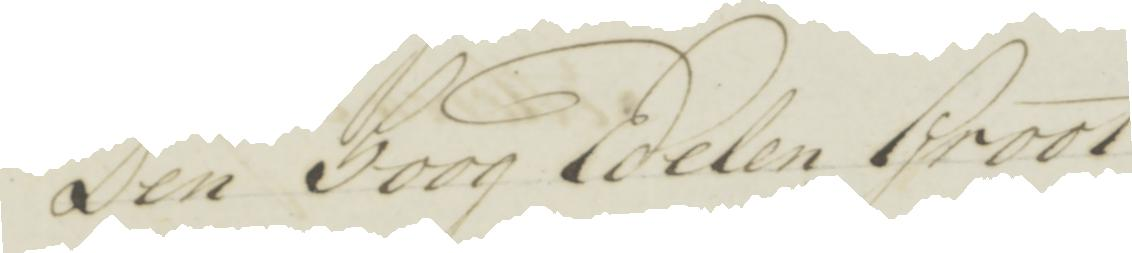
Den Hoog Edelen Groot
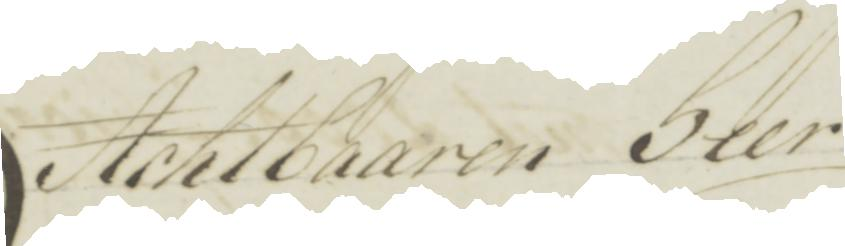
Achtbaaren Heer
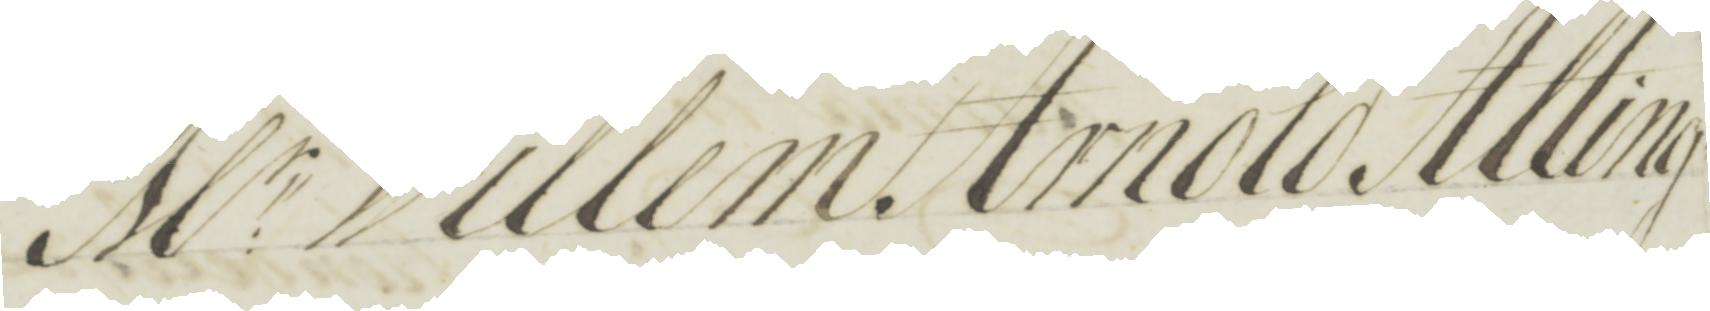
M:r„ Willem Arnold Alting
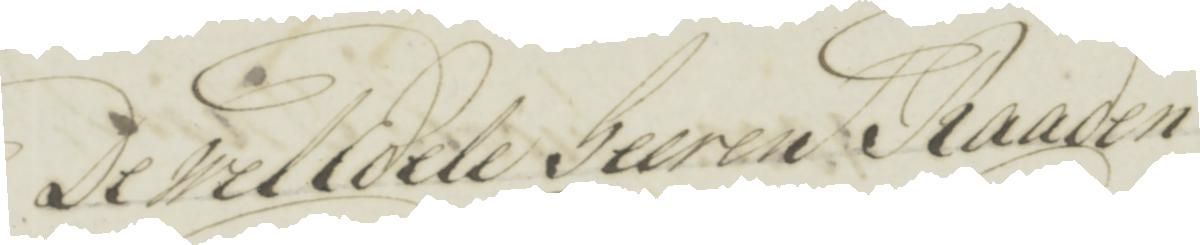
De Wel Edele Heeren Raaden
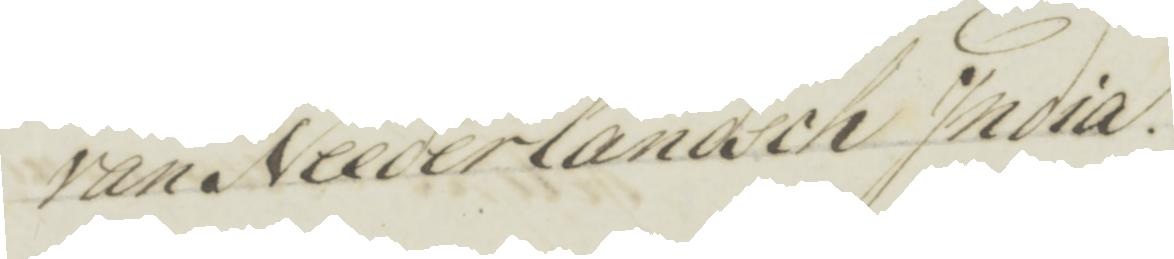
van Neederlandsch Jndia.
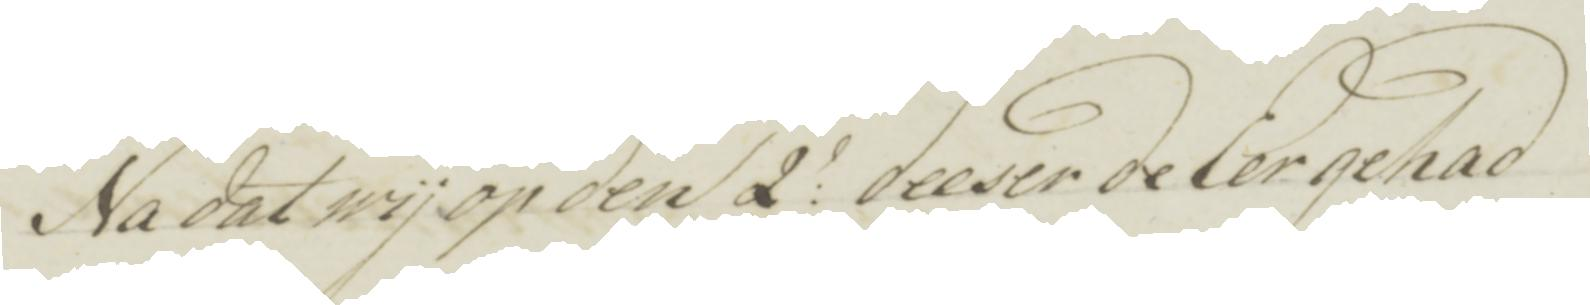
Na dat wij op den 2:' deeser de Eer gehad
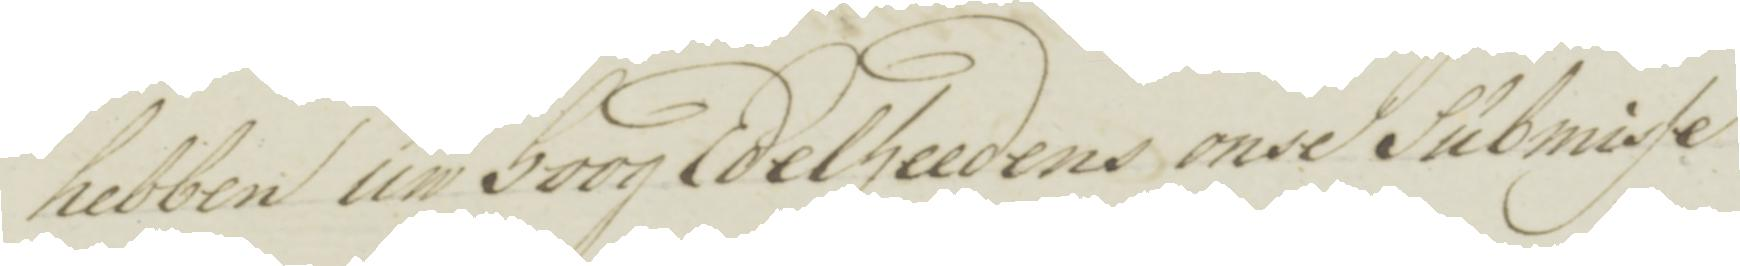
hebben uw hoog Edelheedens onse Submisse
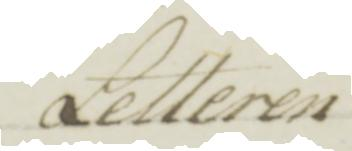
Letteren
